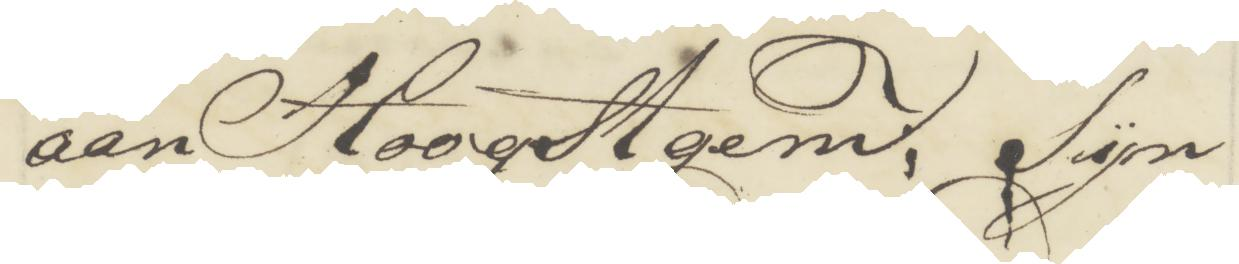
aan Hoogstgem: sijn
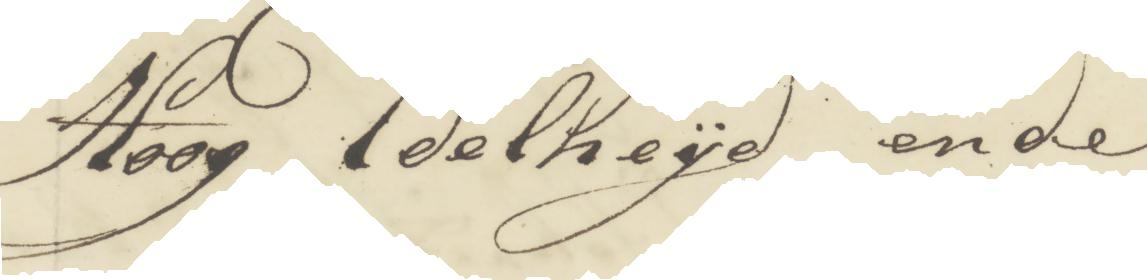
Hoog Edelheijd en de
